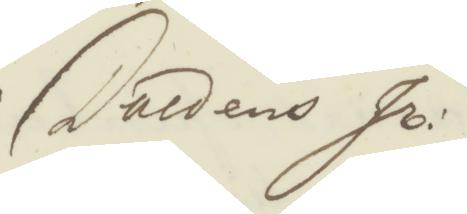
J: Doedens Jr:
